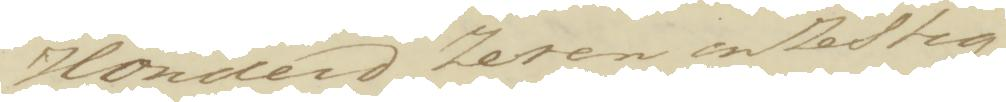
Honderd Zeven en Zestig
